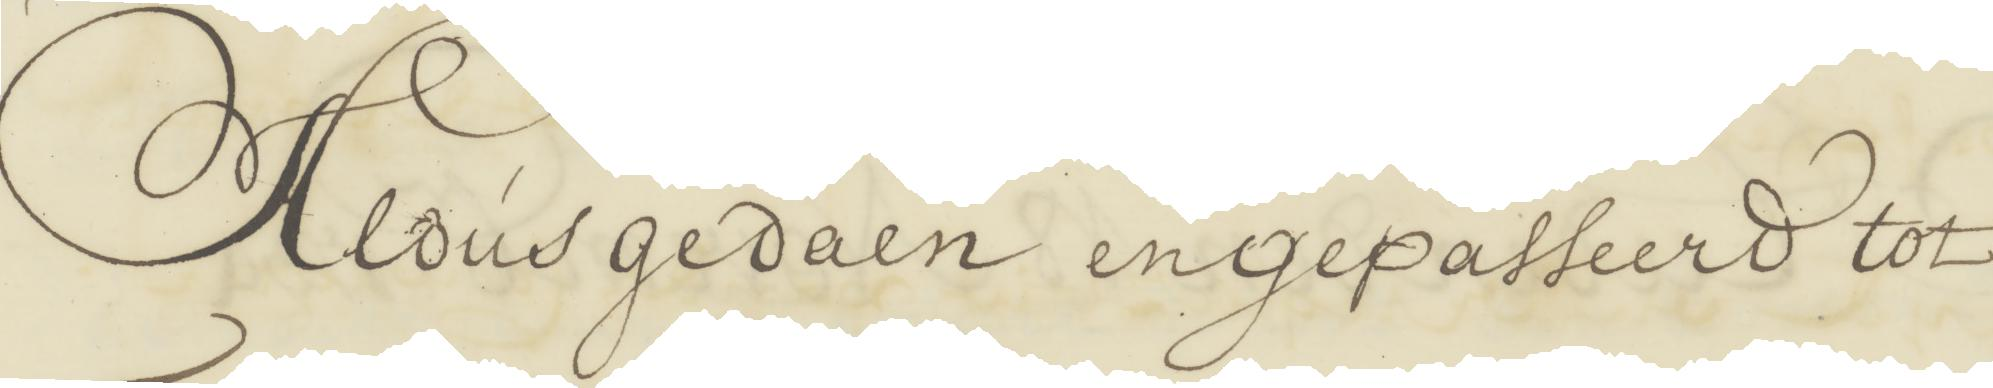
Aldus gedaen en gepasseerd tot
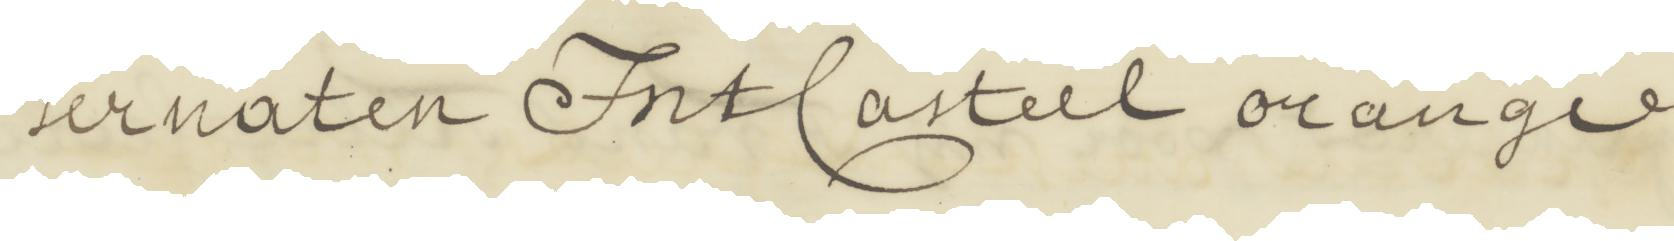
Ternaten Int Casteel orange
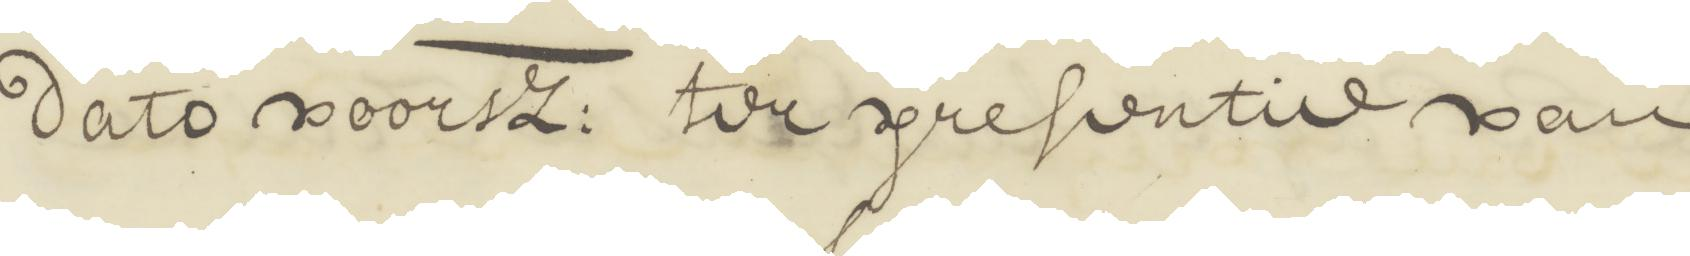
dato voorsz: ter presentie van
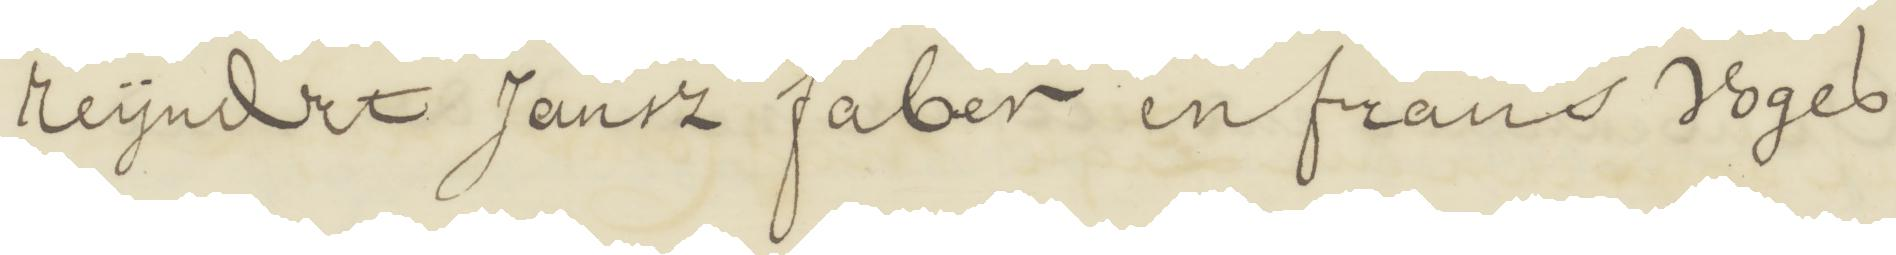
reijndert Jansz faber en frans Voges
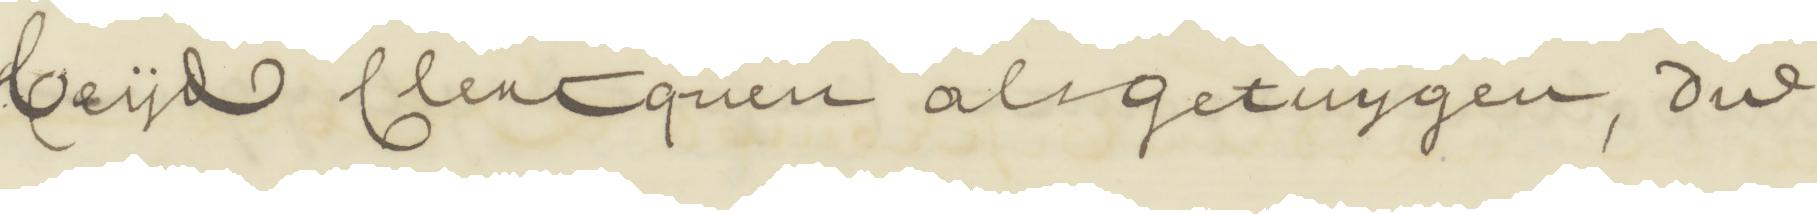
beijde Clercquen als getuygen, die
